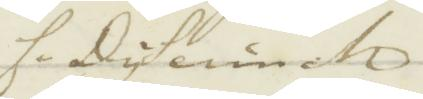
C: Dijserinck
